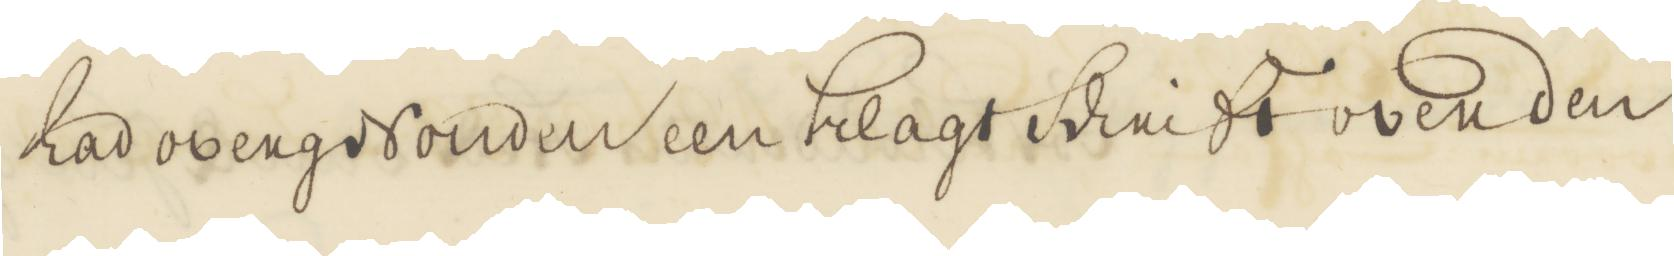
had overgesonden een klagt schrift over den
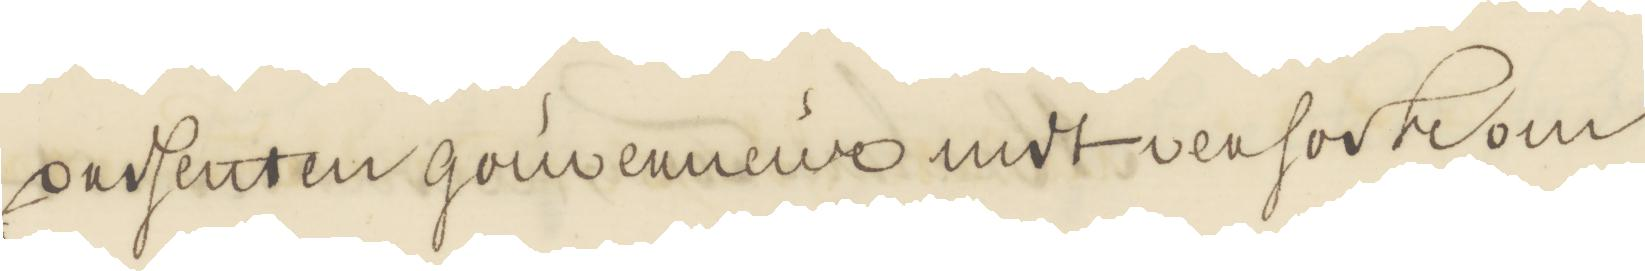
presenten gouverneur met versoek om
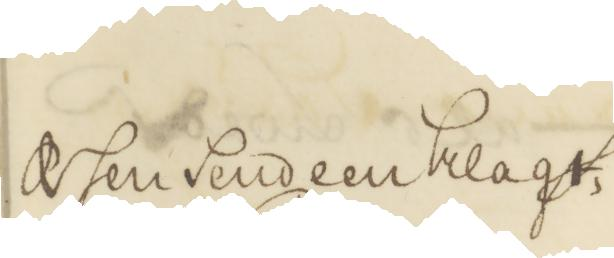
desen send een klagt„
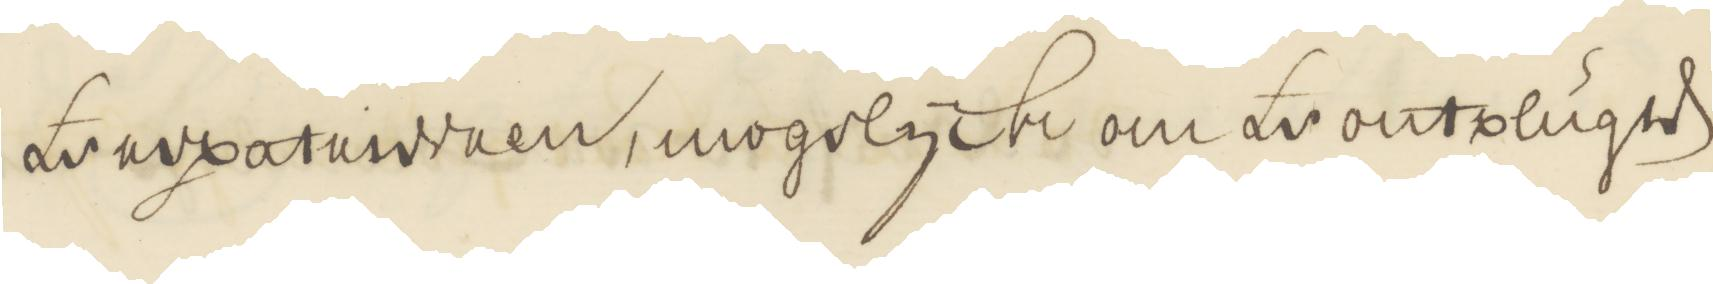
te repatrieeren, mogelijck om te ontvlugten
